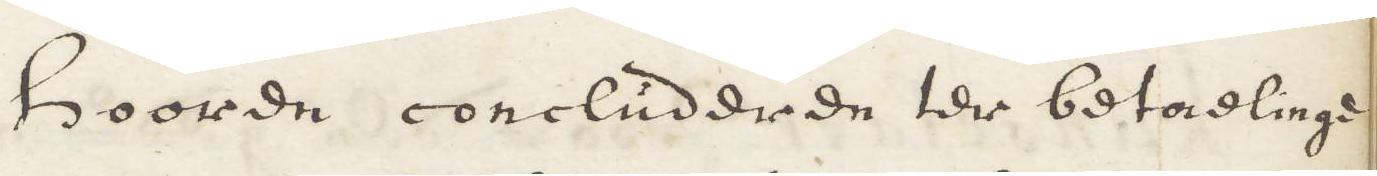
hooren concluderen ter betaelinge
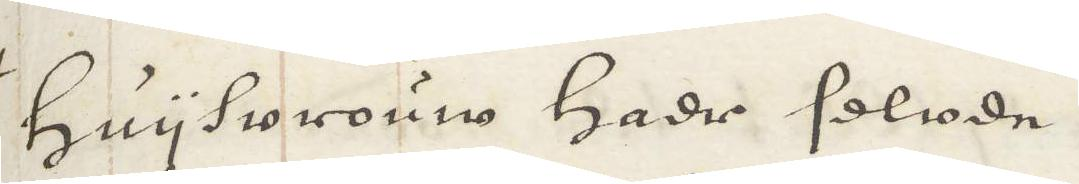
huijsvrouw haer selven
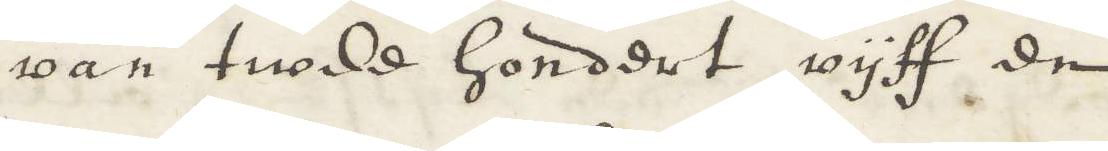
van twee hondert vijff en
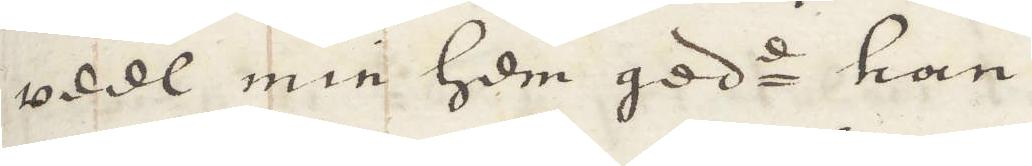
veel min hem ged=e kan
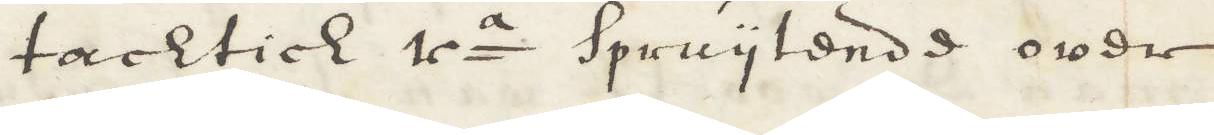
tachtich r=a spruijtende over
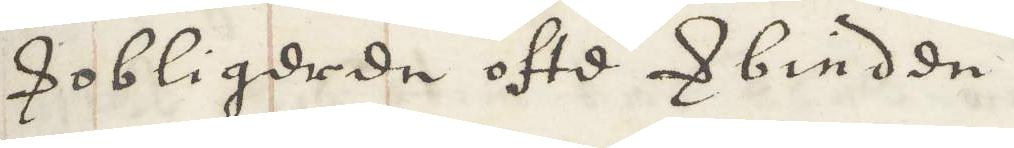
verobligeren ofte verbinden
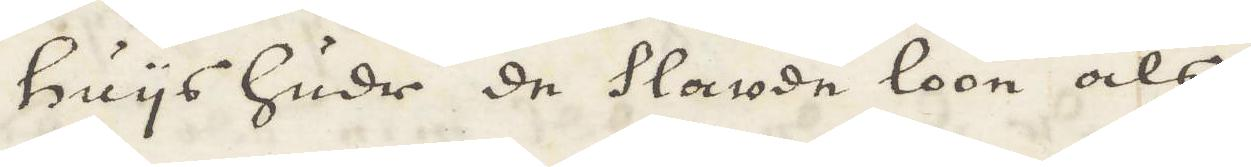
huijs huer en slaven loon als
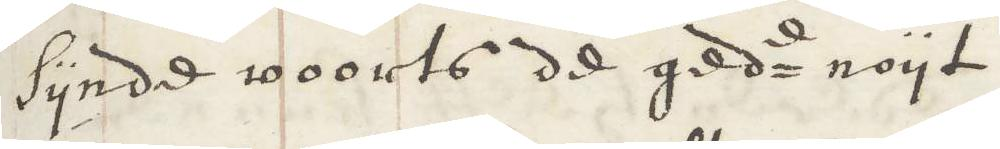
sijnde voorts de ged=e noijt
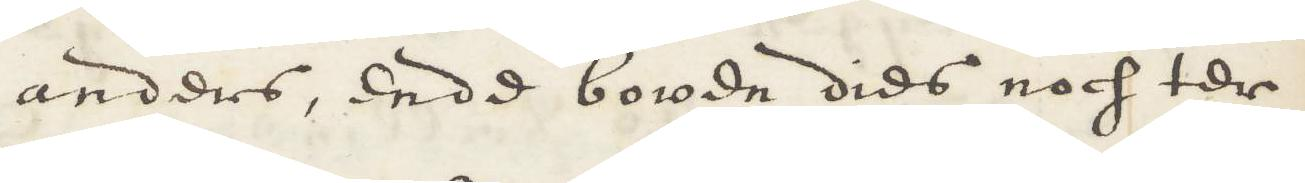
anders, ende boven dies noch ter
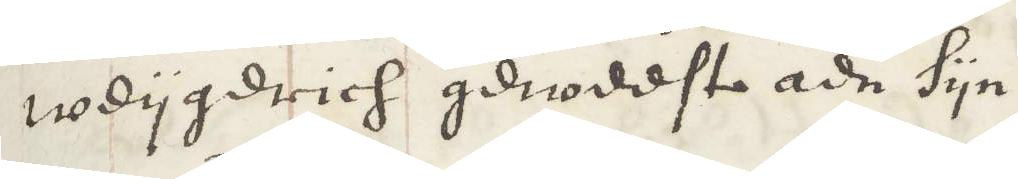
weijgerich geweest aen sijn
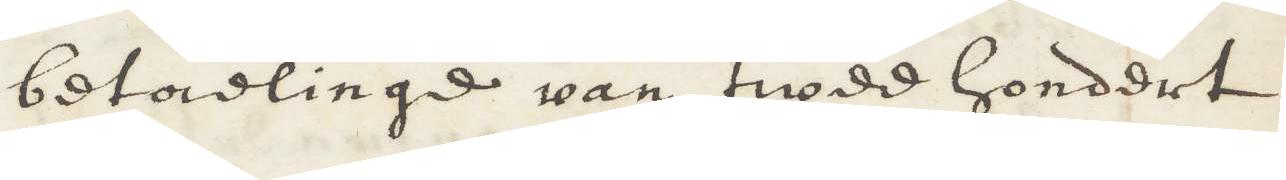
betaelinge van twee hondert
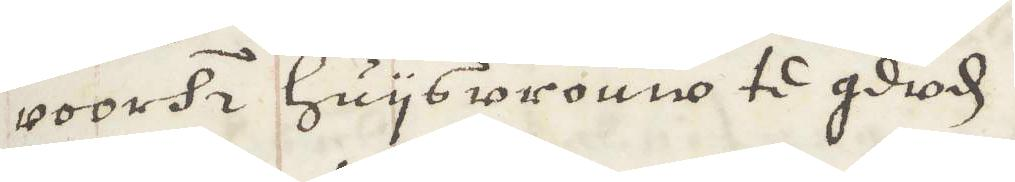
voorsz huijsvrouw te geven
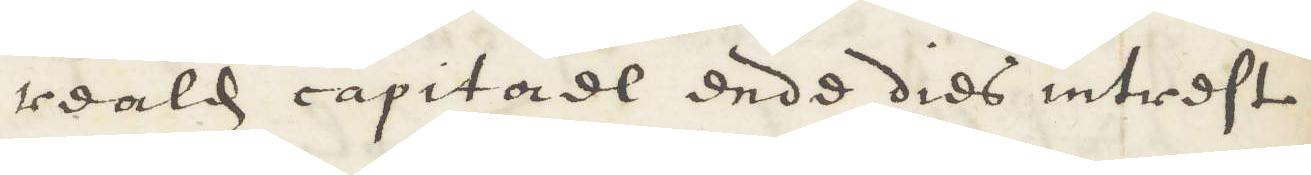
realen capitael ende dies intrest
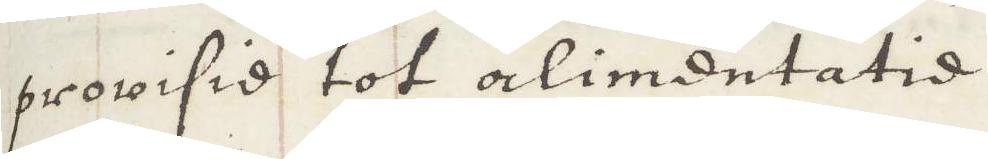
provisie tot alimentatie
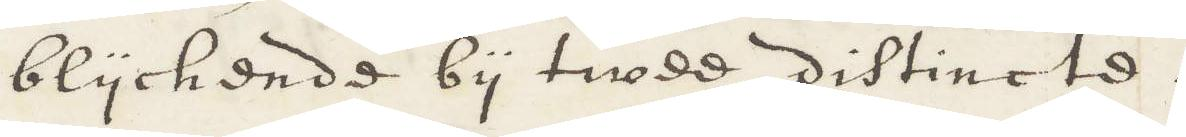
blijckende bij twee distincte
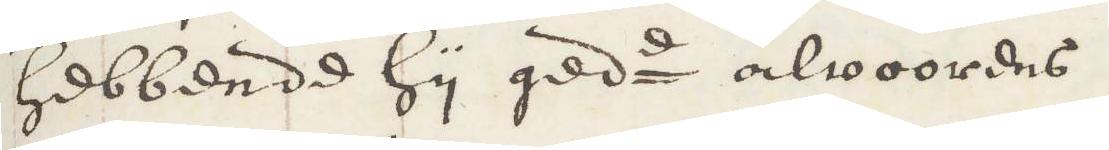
hebbende bij ged=e alvoorens
